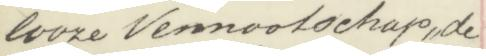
looze Vennootschap „ de
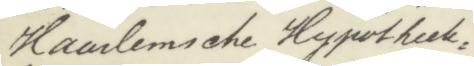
Haarlemsche Hypotheek
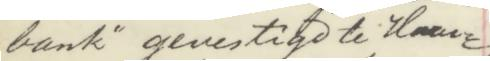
bank" gevestigd te Haar
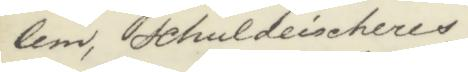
lem, Schuldeischeres
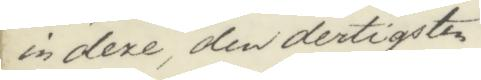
in deze, den dertigsten
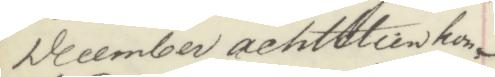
December achttien hon=
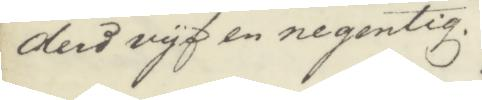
derd vijf en negentig.
